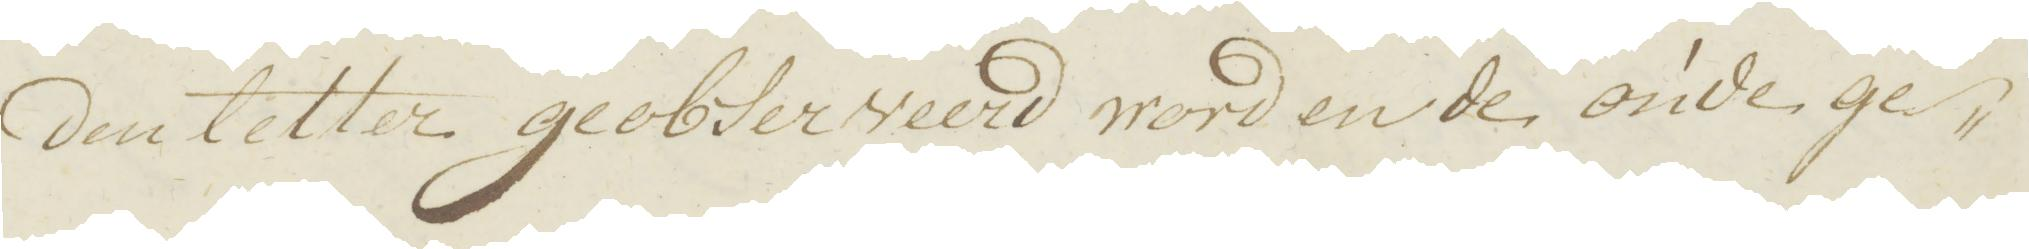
den letter geobserveerd word en de oude ge„
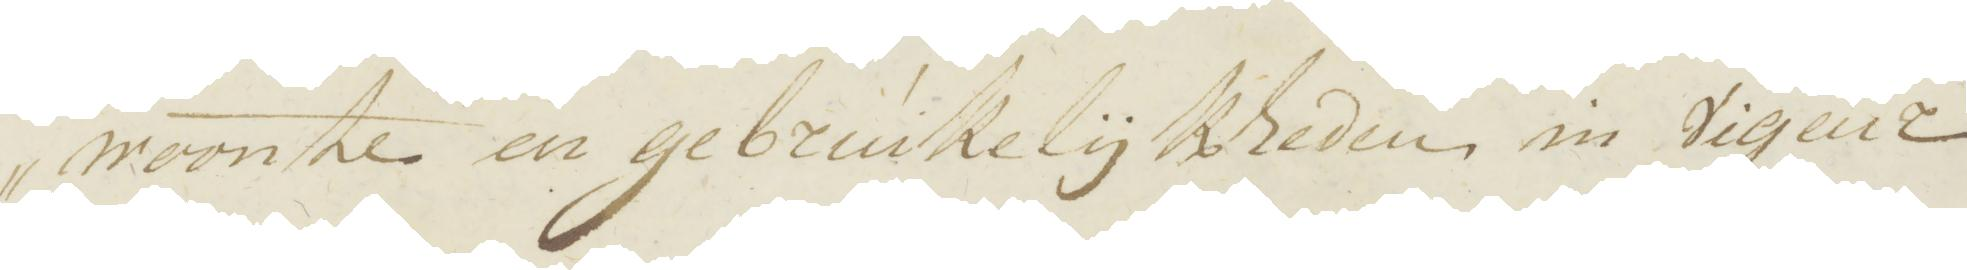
„woonte en gebruikelijkheden in vigeur
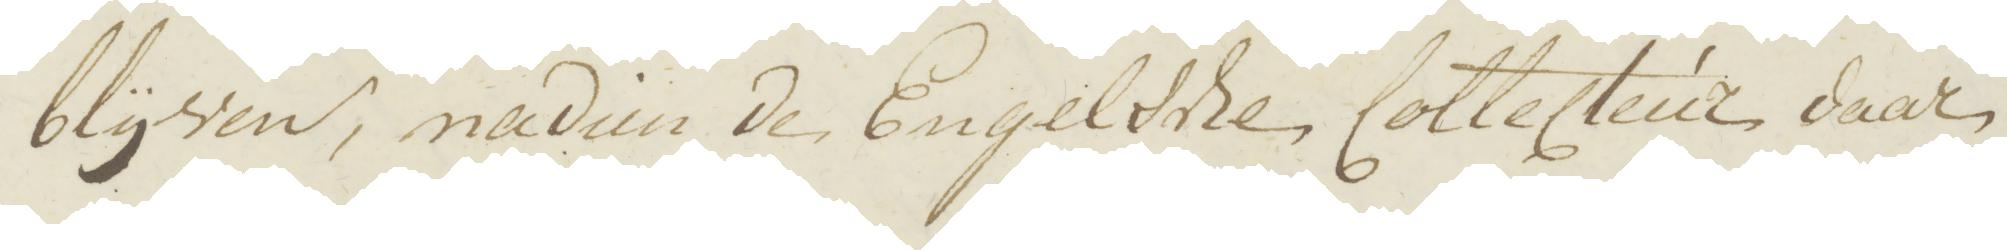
blijven, nadien de Engelsche Collecteur daar
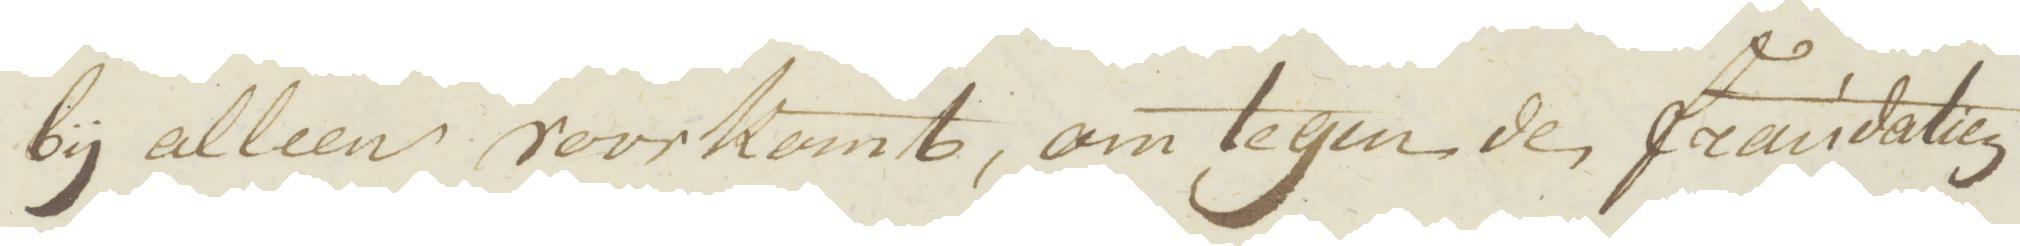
bij alleen voorkomt, om tegen de fraudatien
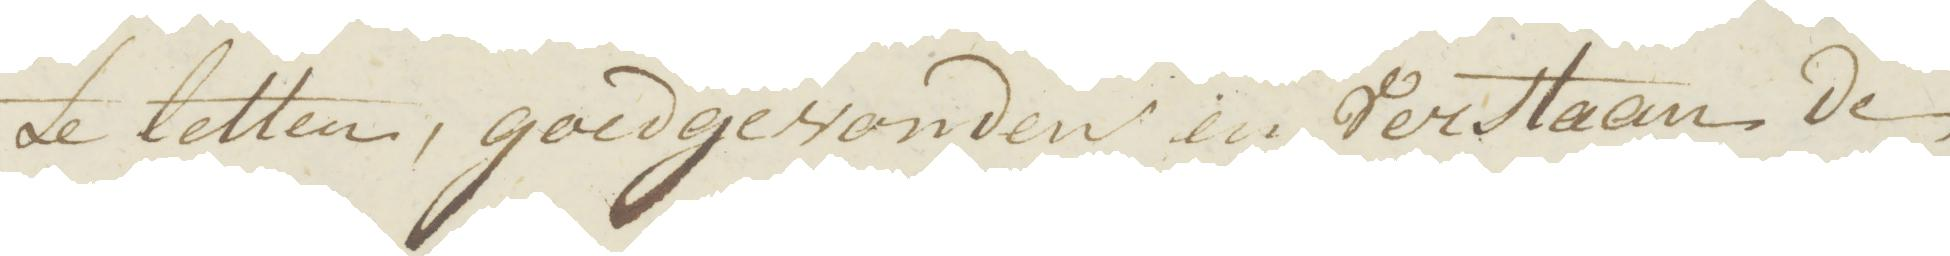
te letten, goedgevonden en verstaan de
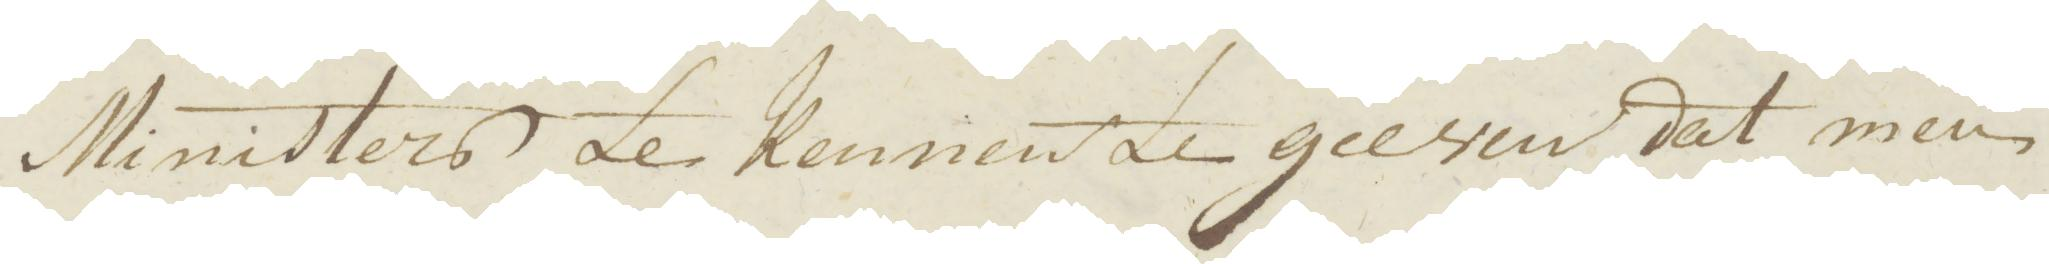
Ministers te kennen te geeven dat men
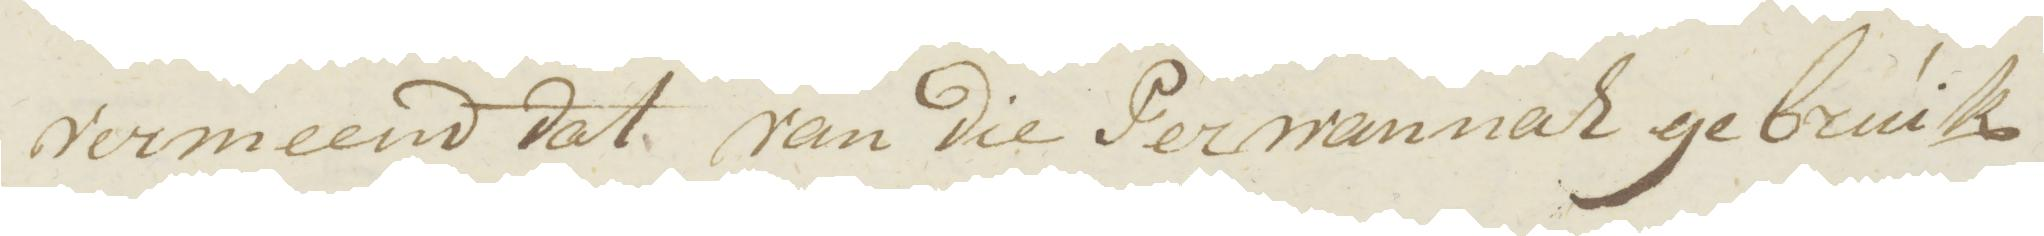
vermeend dat van die Perwannah gebruik
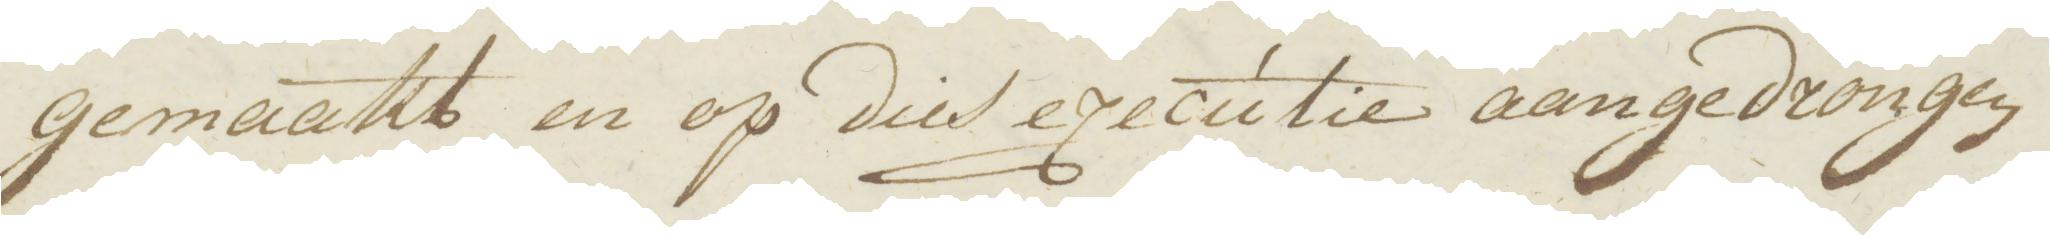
gemaakt en op dies executie aangedrongen
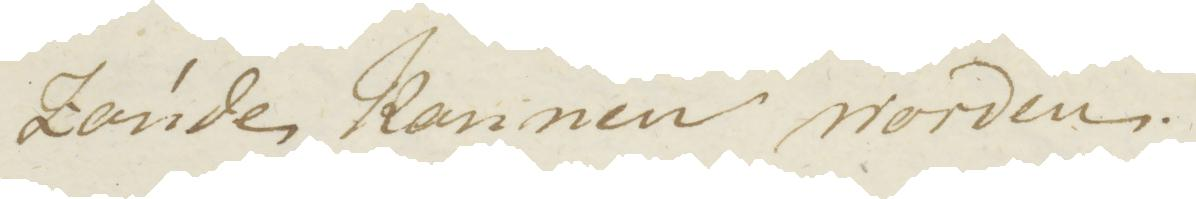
zoude kannen worden.
